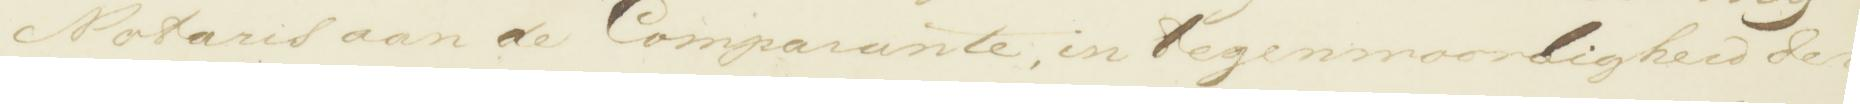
Notaris aan de Comparante, in tegenwoordigheid der
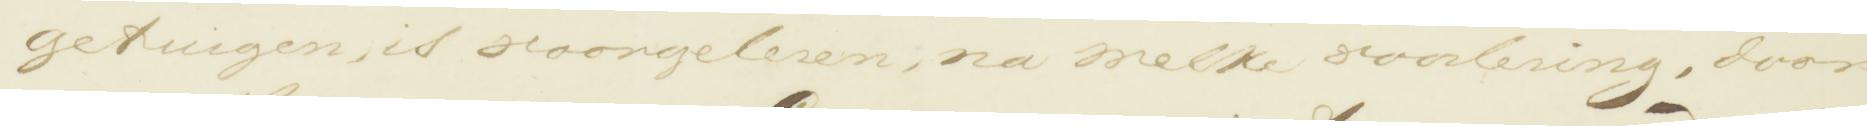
getuigen, is voorgelezen, na welke voorlezing, door
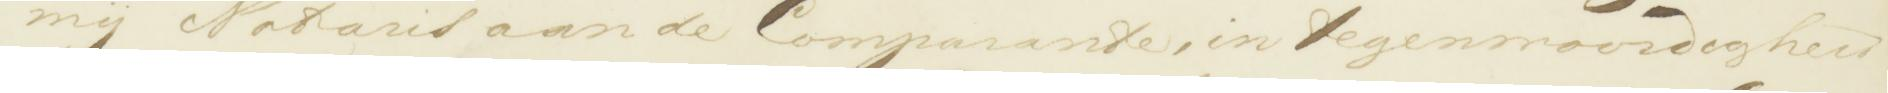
mij Notaris aan de Comparante, in tegenwoordigheid
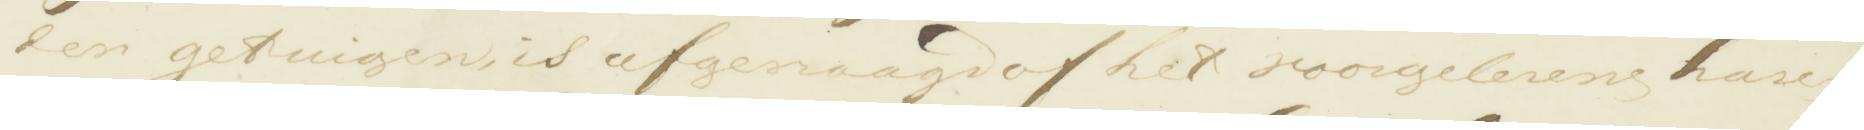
der getuigen, is afgevraagd of het voorgelezene harer
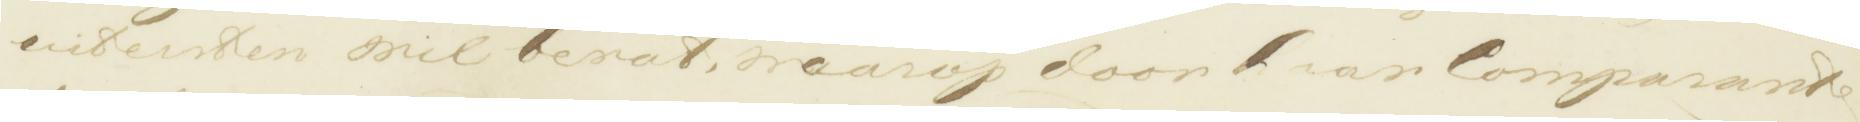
uitersten wil bevat, waarop door haar Comparante
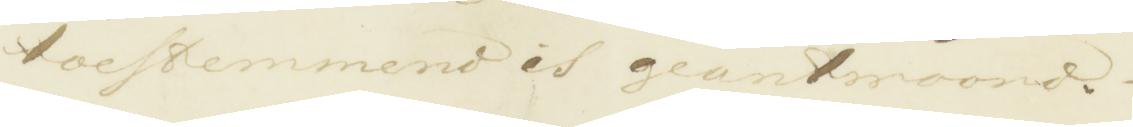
toestemmend is geantwoord.
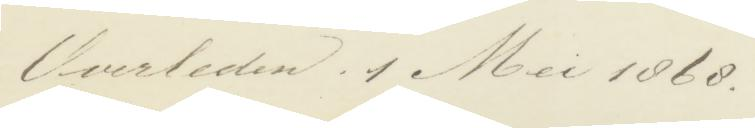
Overleden. 1 Mei 1868.
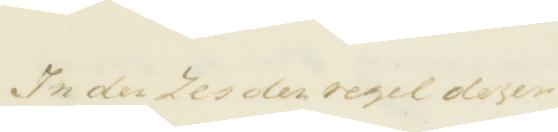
In den Zesden regel dezer
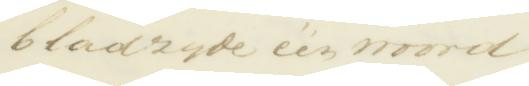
bladzyde één woord
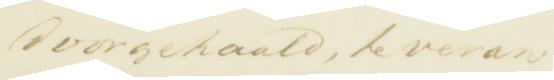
doorgehaald, te veran
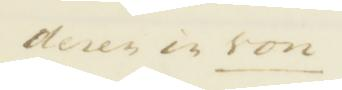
deren in von
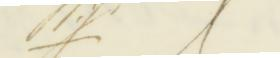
W.S. C
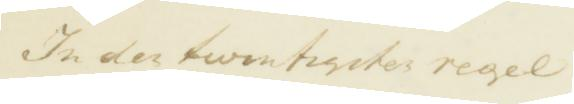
In den twintigsten regel
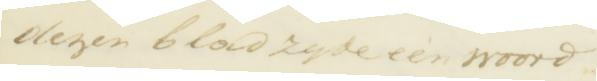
dezer bladzyde één woord
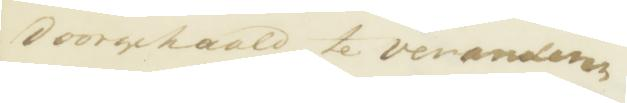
doorgehaald te veranderen
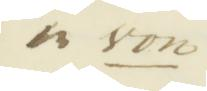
in von
